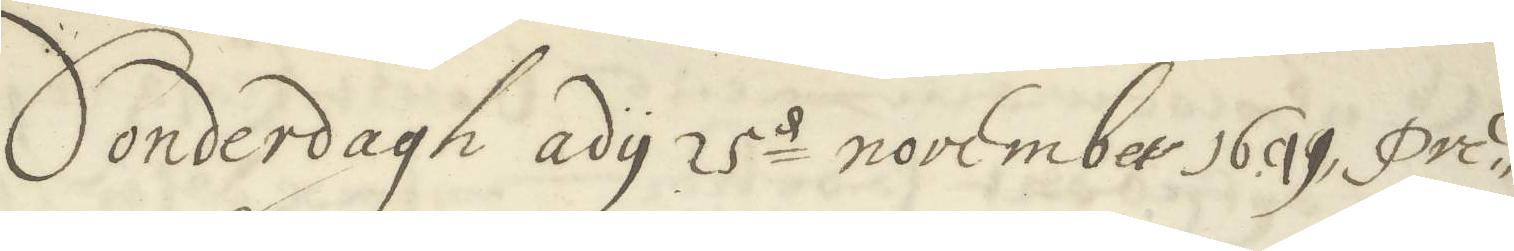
Donderdagh adij 25=en november 1649, Pre„
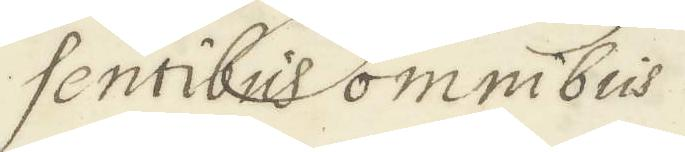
sentibus omnibus
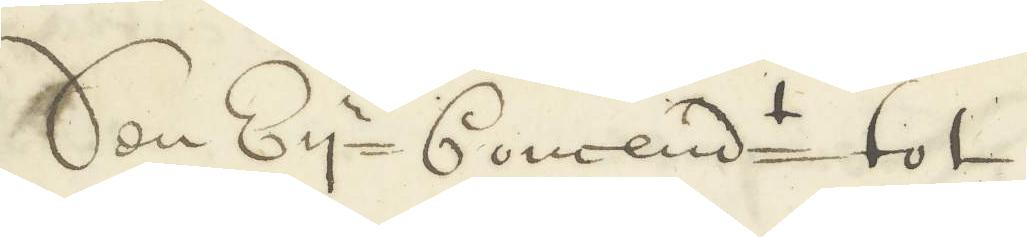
Den Ey=r Conclud=t tot
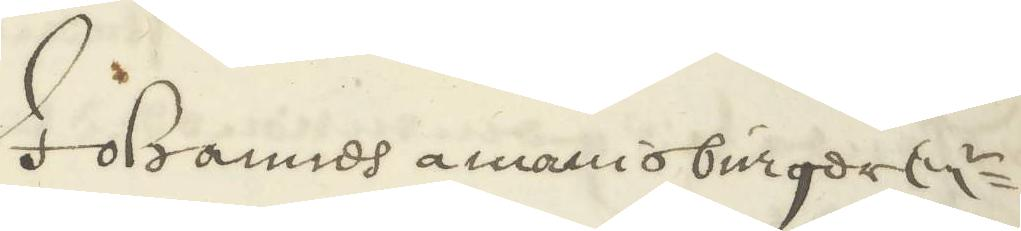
Iohannes amanis burger Ey=r
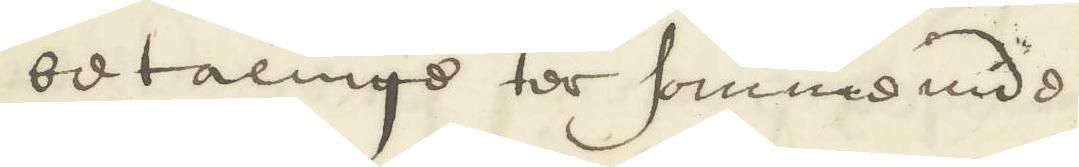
betalinge ter somme inde
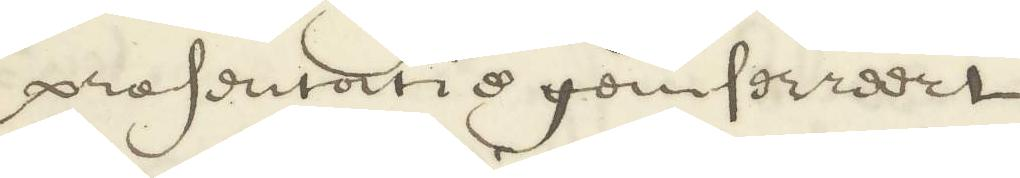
presentatie geinsereert
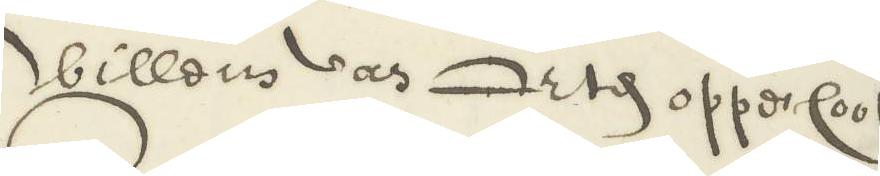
Willem van Orten oppercoop=m
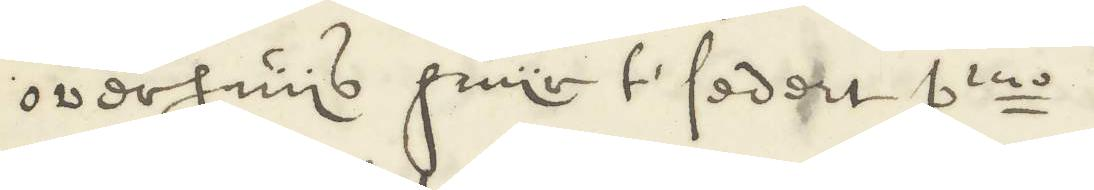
overluijs huijr t' sedert p=mo
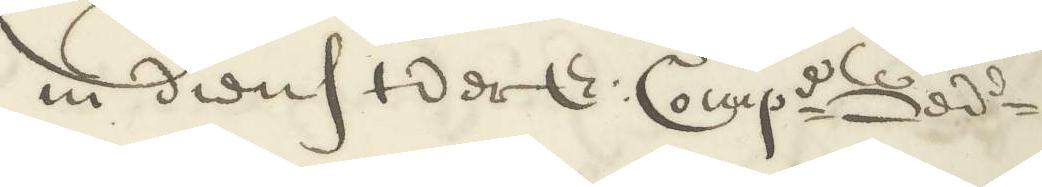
in dienst der E: Comp=e Ged=e
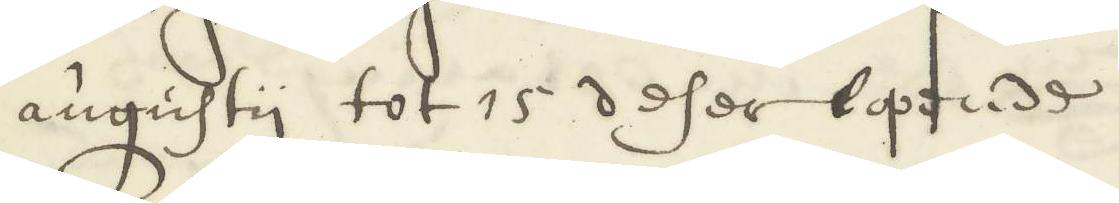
augustij tot 15 deses lopende
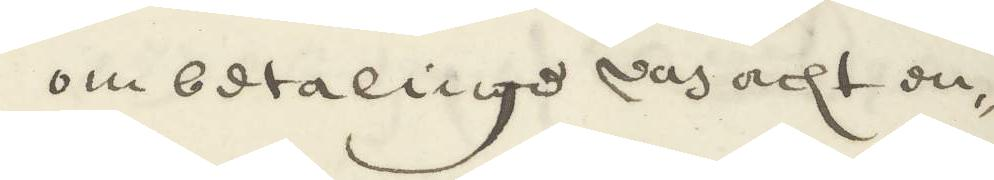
om betalinge van acht en„
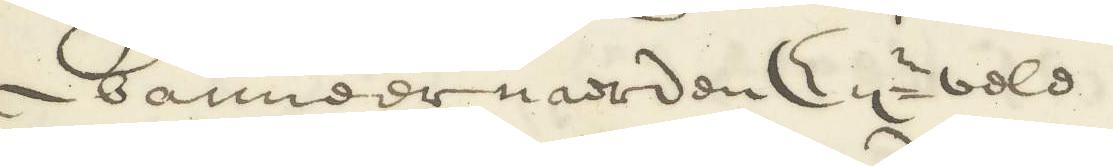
wanneer naer den Ey=r vele
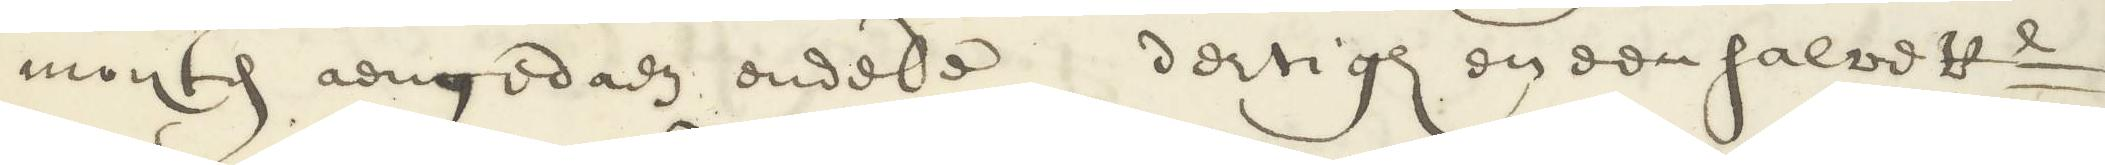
moyten aengedaen ende de dertigh en een halve R=l
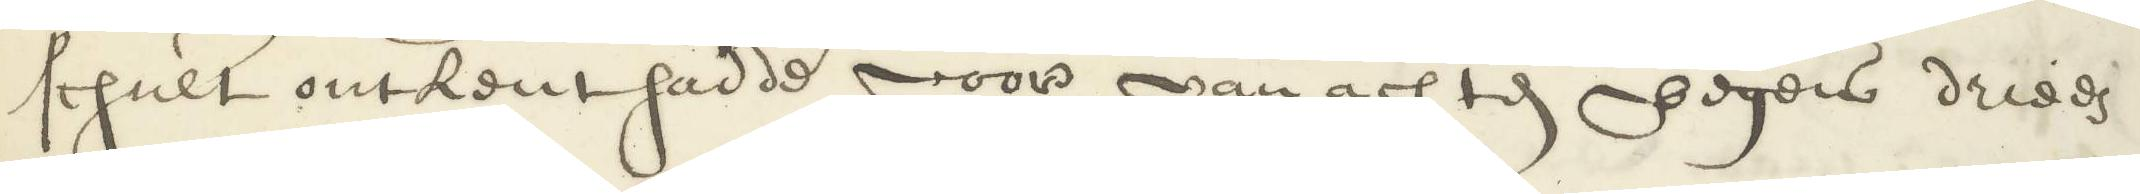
schult ontkent hadde voor van achten wegens drie en
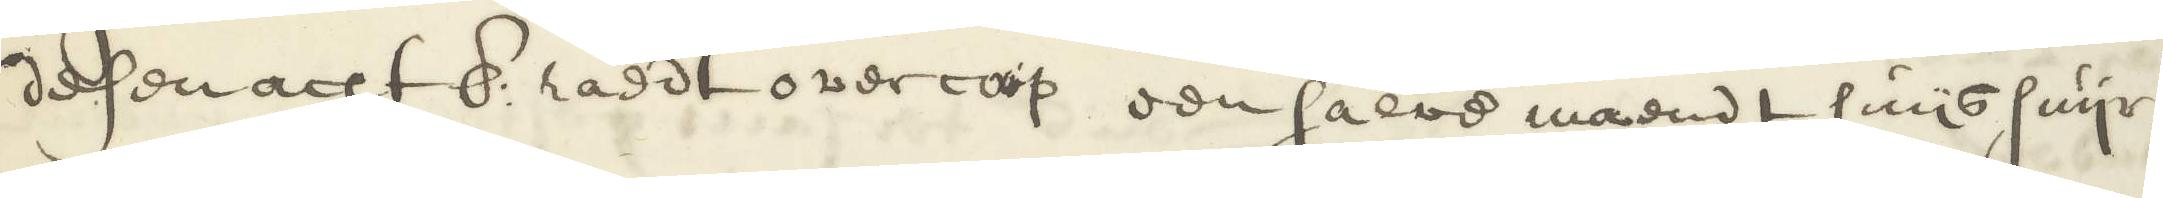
desen achtb: raedt overcoop een halve maendt huijs huijr
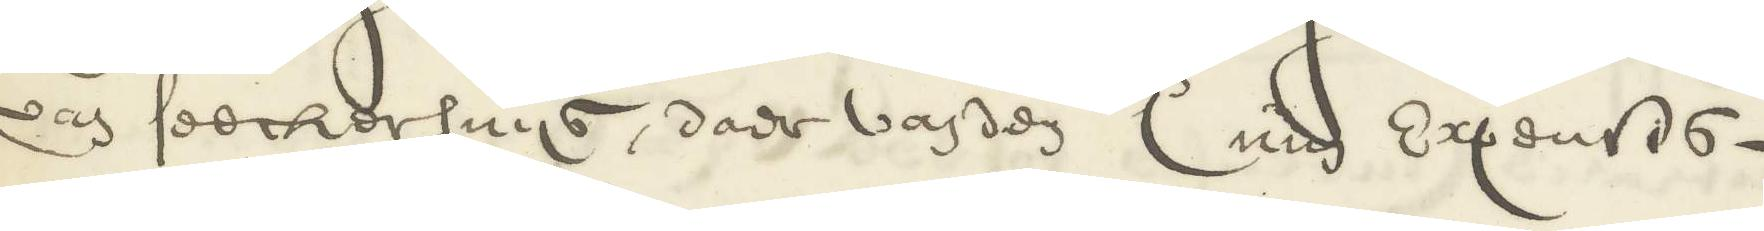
van seeckerhuys, daer van den Cum Expensis
